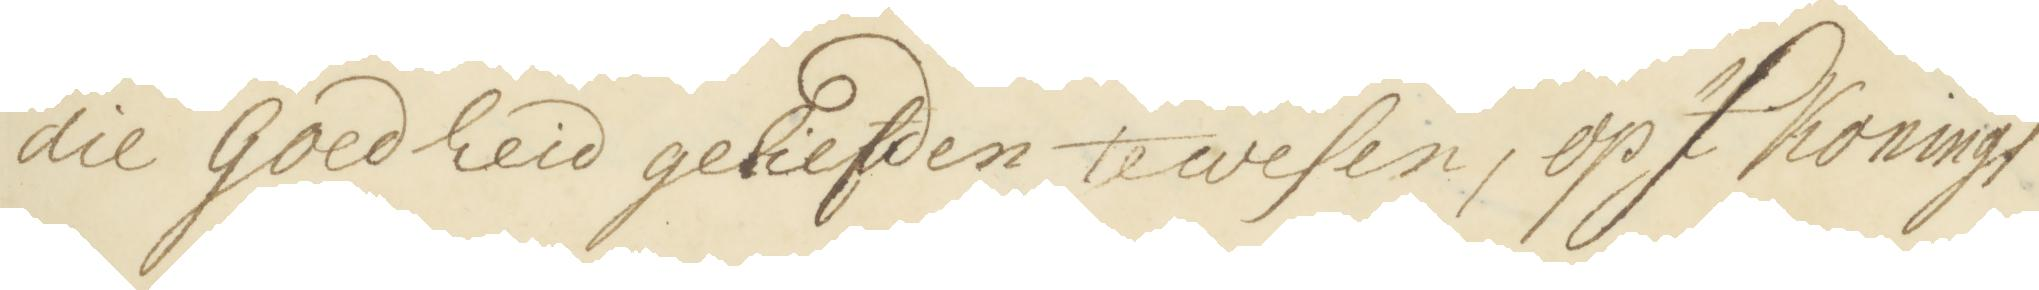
die goedheid geliefden te wesen, op 'S Konings
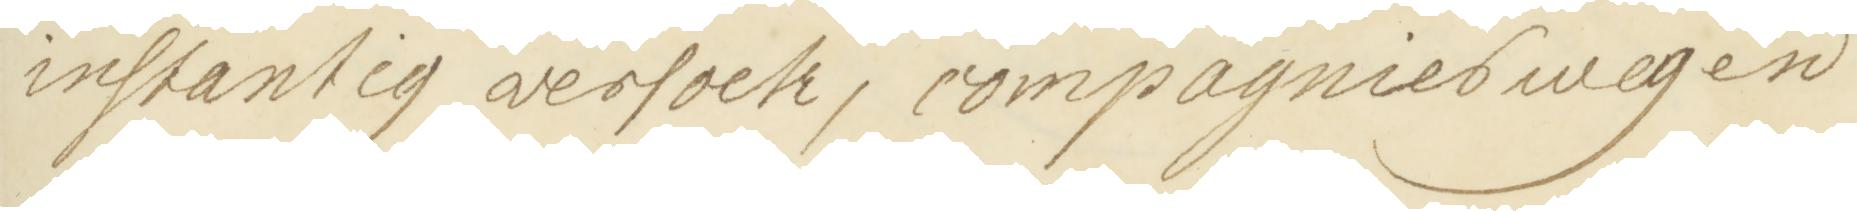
instantig versoek, compagnieswegen
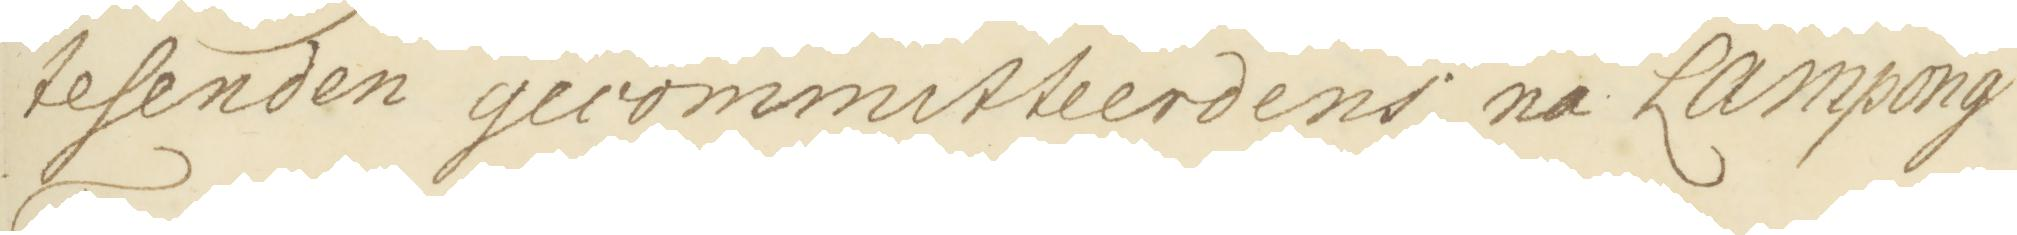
tesenden gecommitteerdens na Lampong
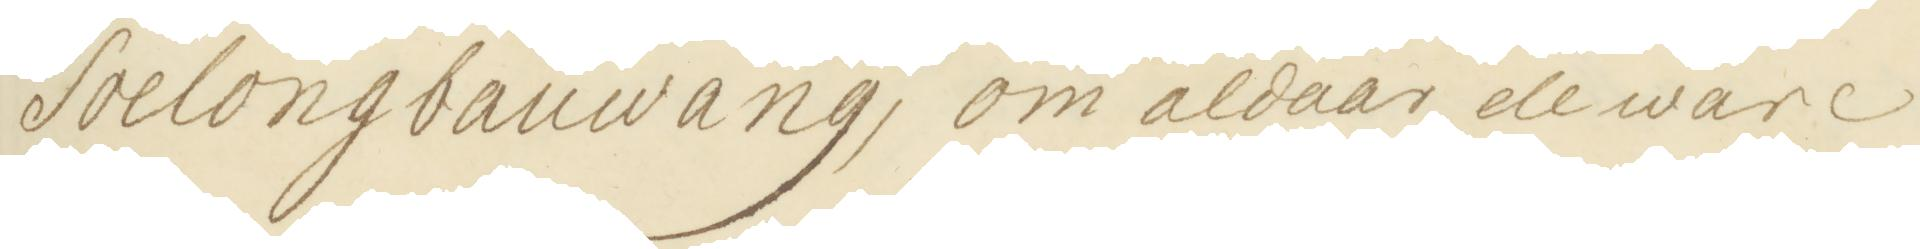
Toelongbauwang, om aldaar de ware
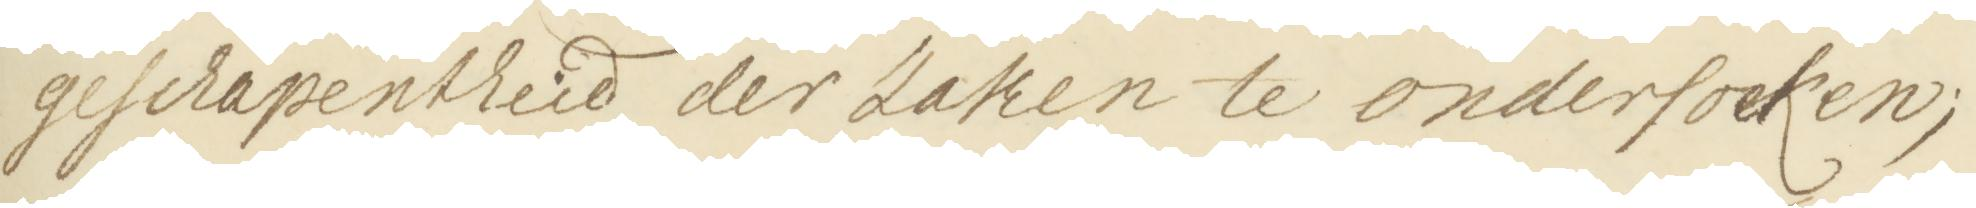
geschapentheid der zaken te ondersoeken;
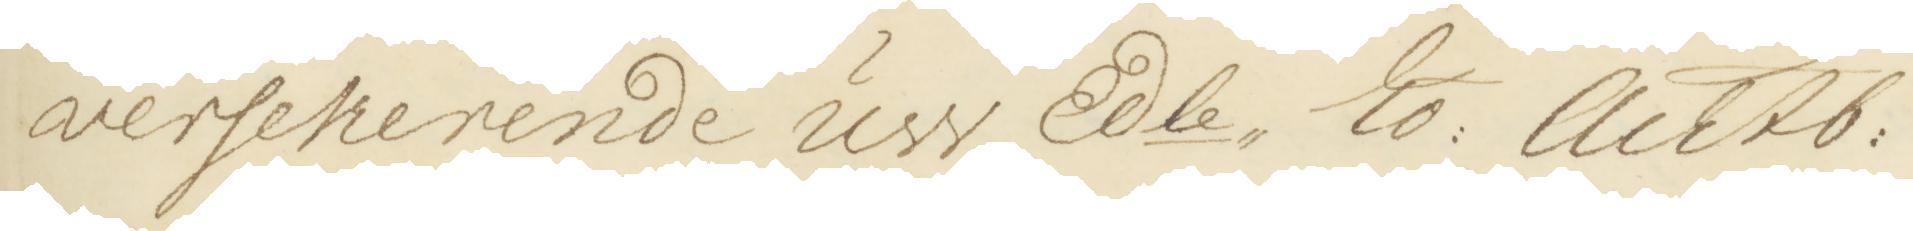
versekerende uw Edle„ ho: Achtb:
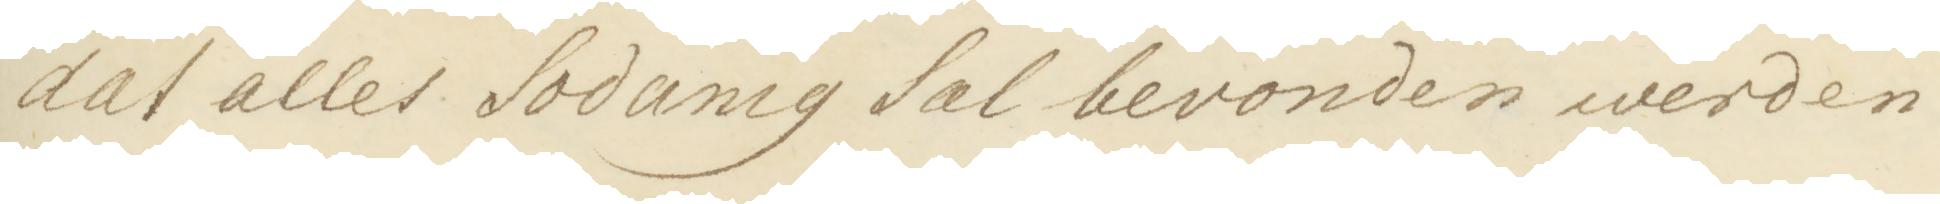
dat alles sodanig sal bevonden werden
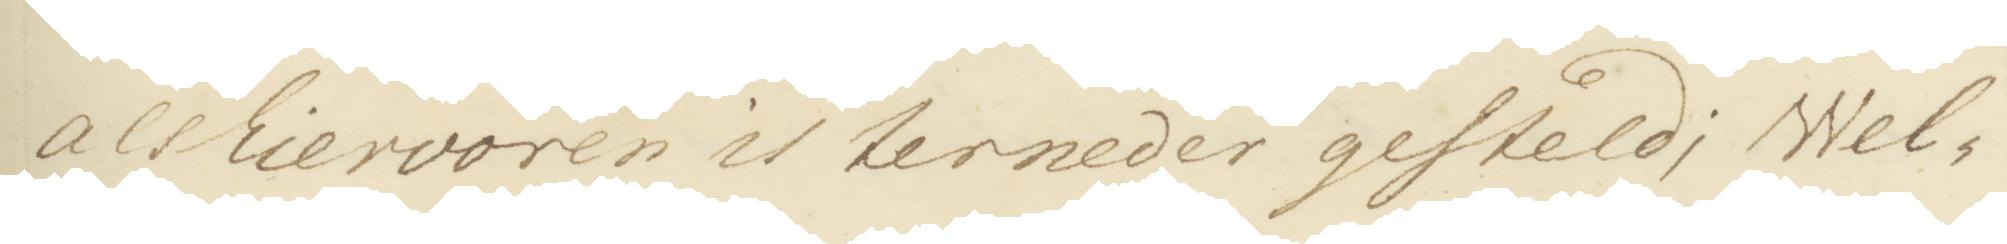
als hiervoren is terneder gesteld; Wel„
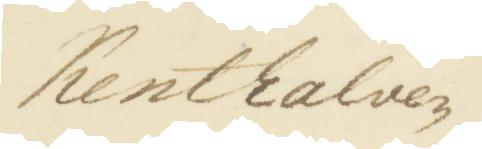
kenthalven
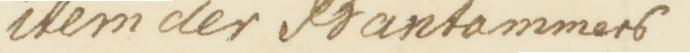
item der Bantammers
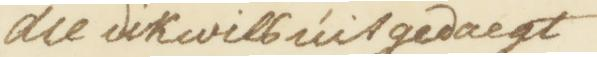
die dikwils uit gedaegt
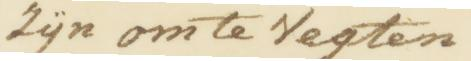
Zijn om te Vegten
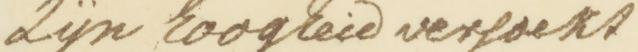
Zijn hoogheid versoekt
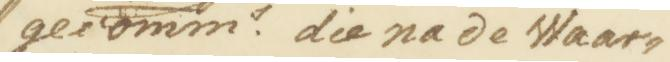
gecomm.s die na de Waar„
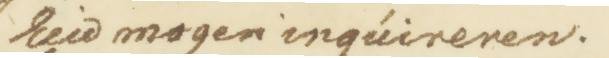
heid mogen inquireren.
